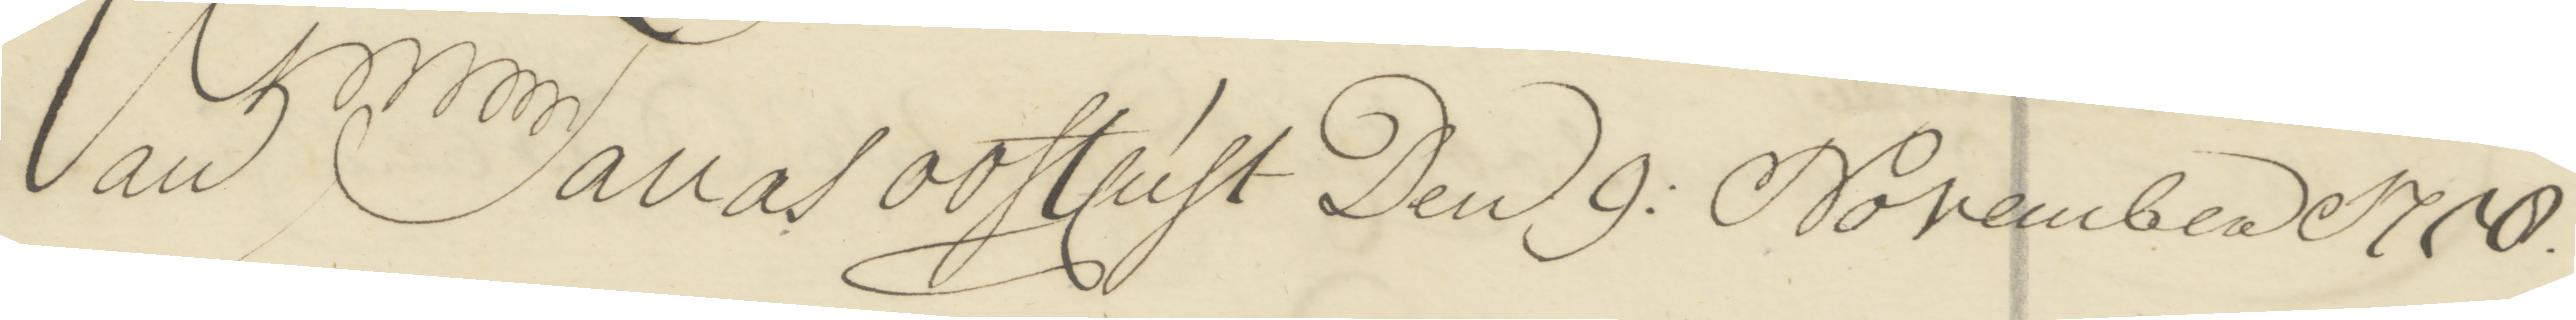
Van Javas oostcust Den 9: November 1758.
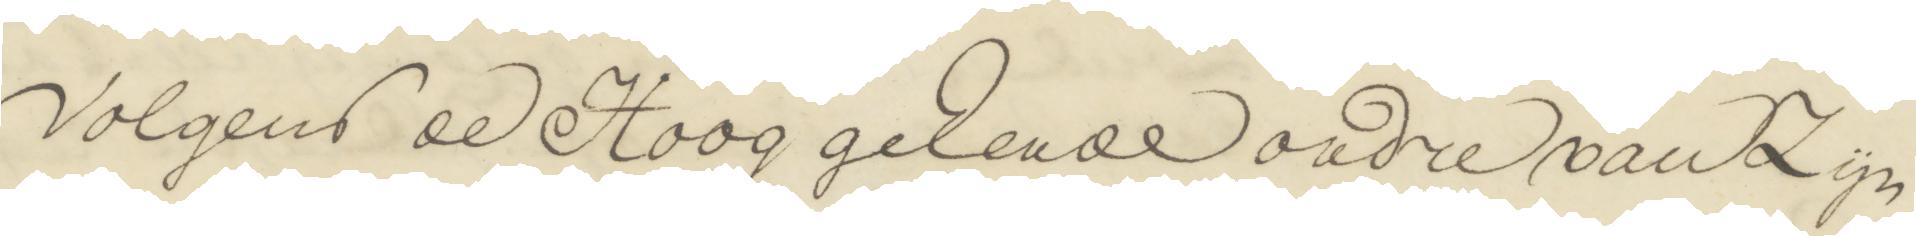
volgens de Hoog geEerde ordre van zijn
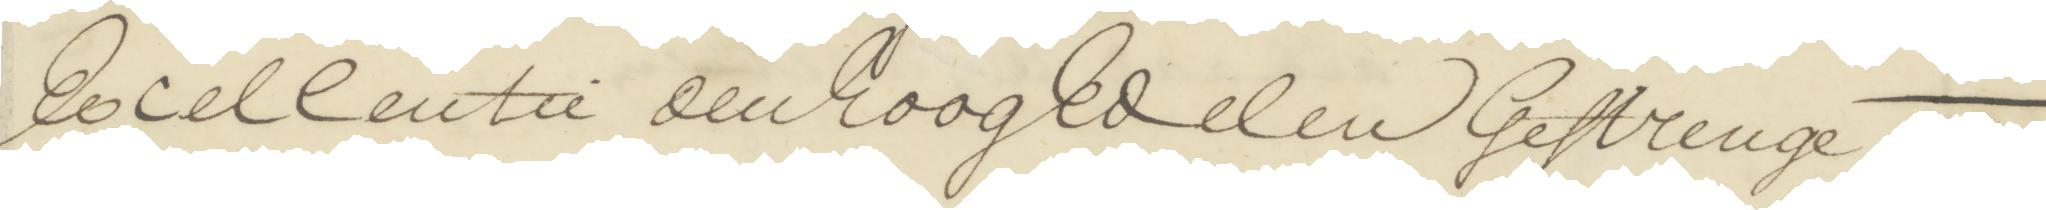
Excellentie den hoog Edelen Gestrenge gr:
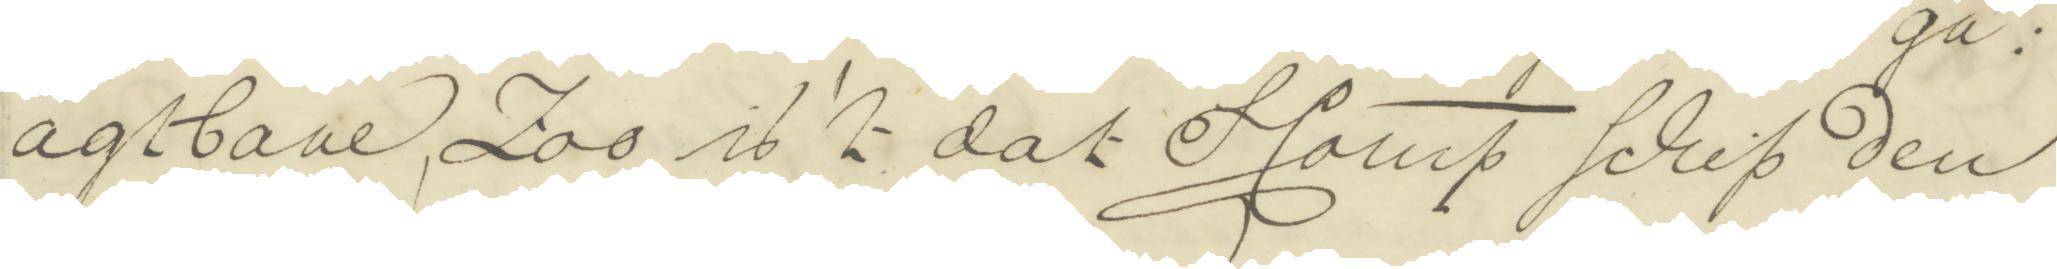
agtbare, zoo is 't dat SComp schip den
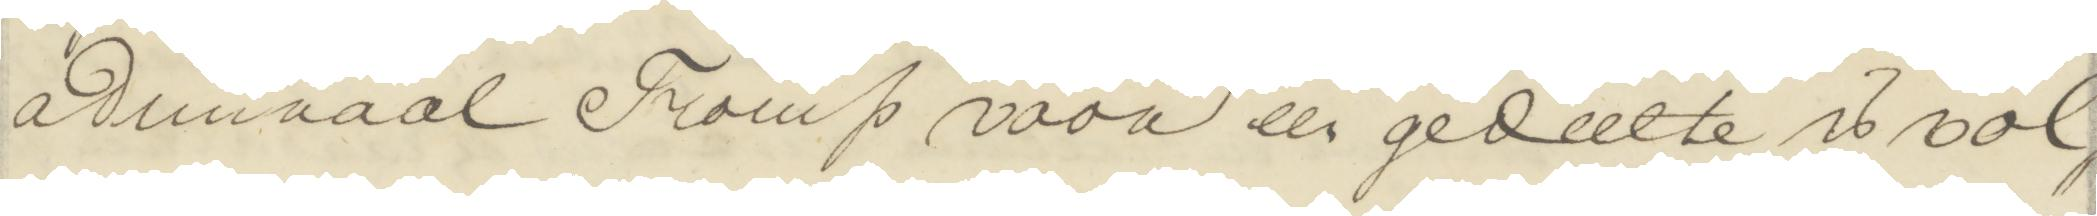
admiraal Tromp voor een gedeelte is vol
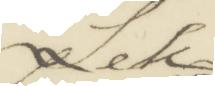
Lek
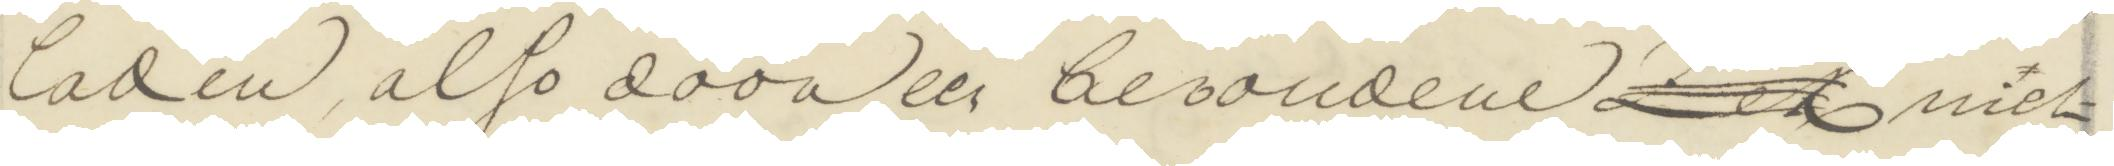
laden, also door een bevondene Zek niet
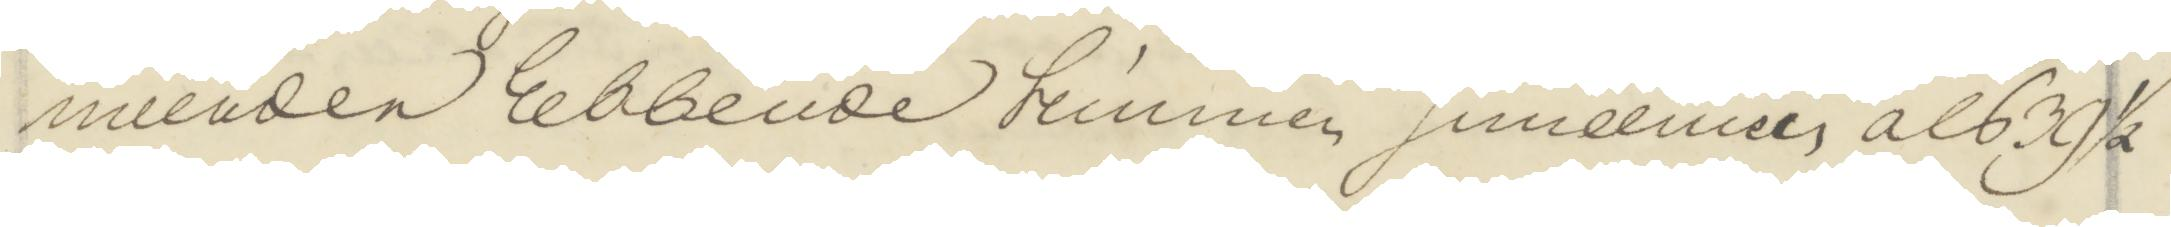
meerder hebbende kunnen Jnneemen als 39½
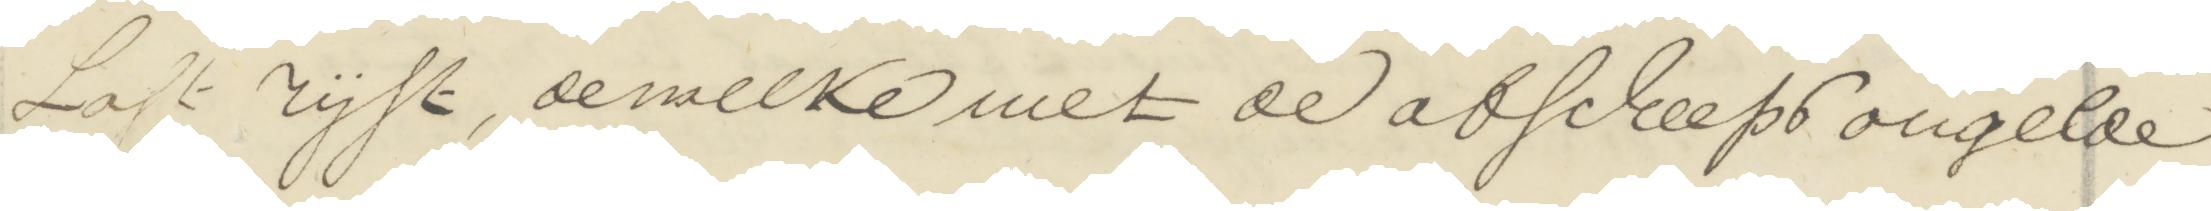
Last rijst, dewelke met de afscheeps ongelde
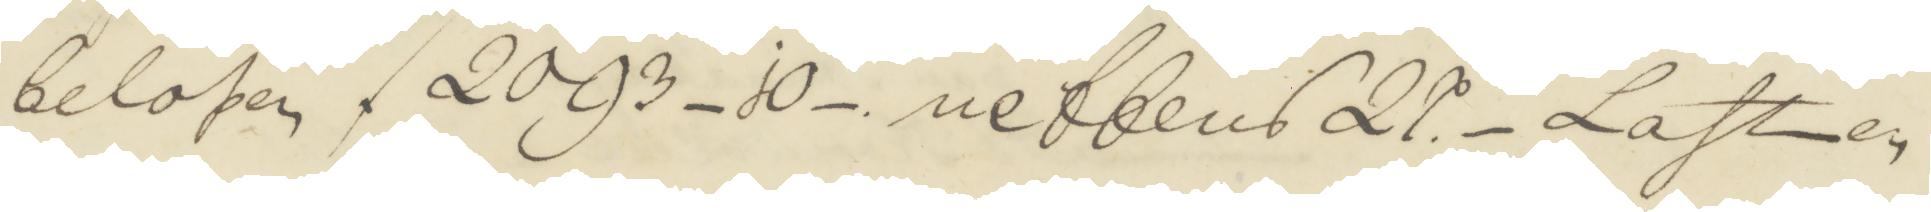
belopen ƒ2093—10—. neffens 27.— Lasten
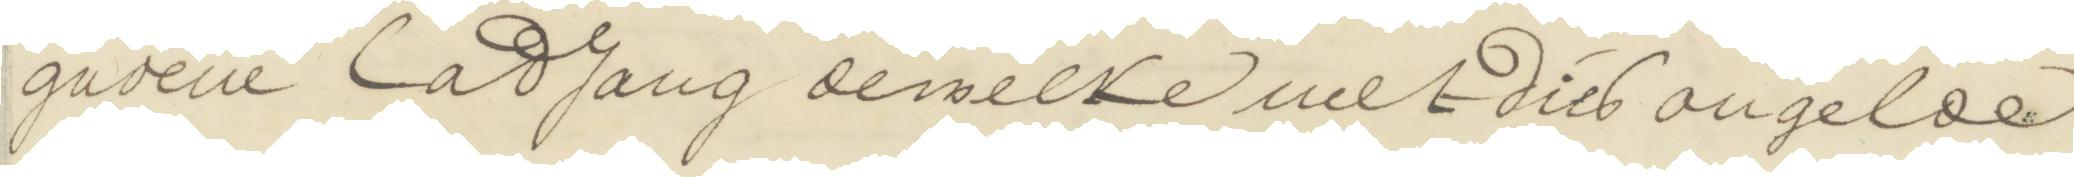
groene Cadjang dewelke met dies ongelde
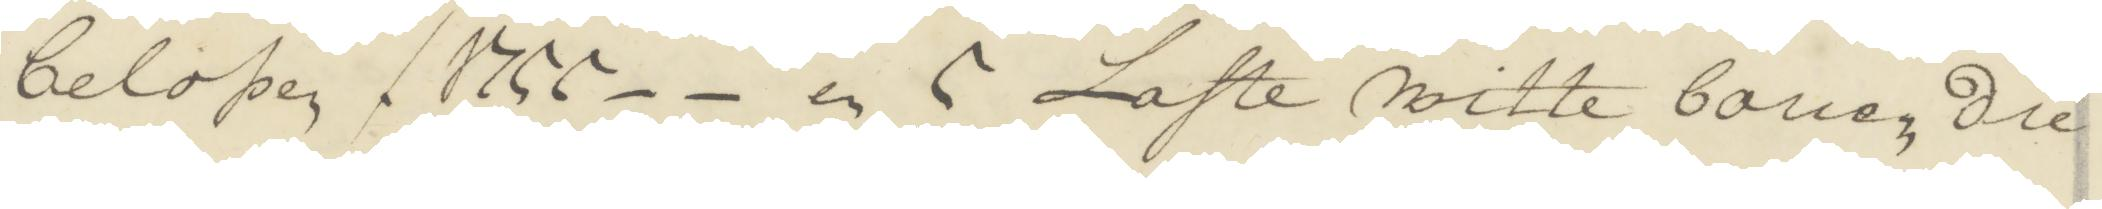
belopen ƒ1755 — — en 5 Laste witte bonen die
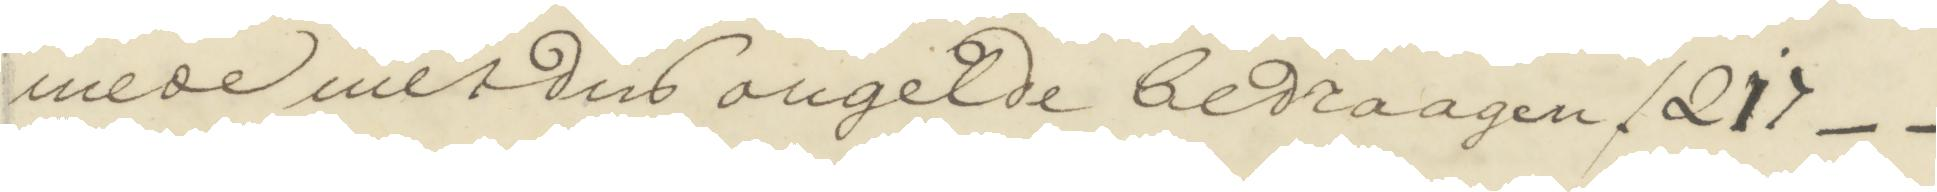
mede met dus ongelde bedraagen ƒ217 — —
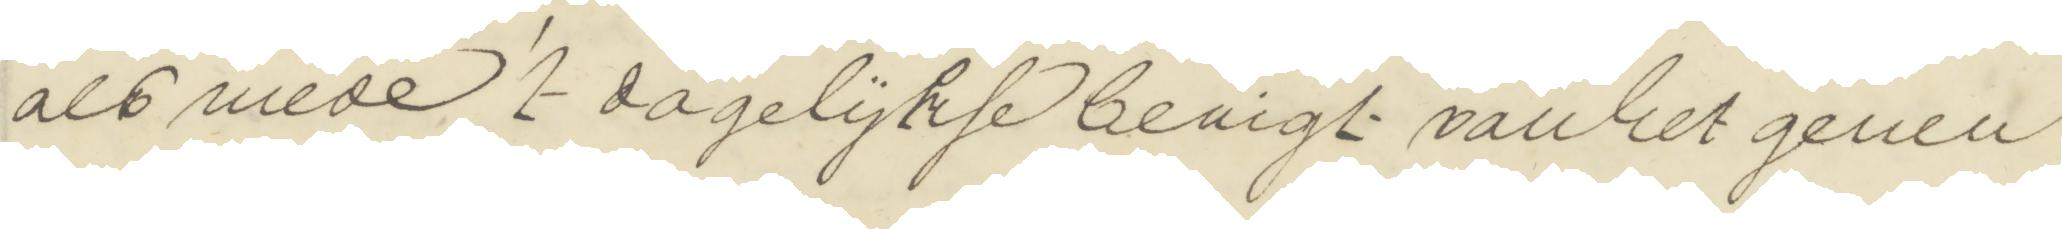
als mede 't dagelijkse berigt van het genen
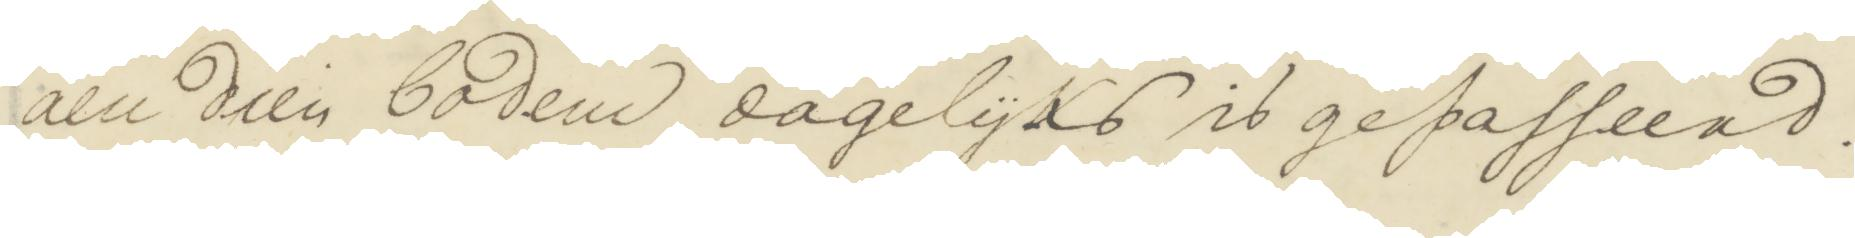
aen dien bodem dagelijks is gepasseerd
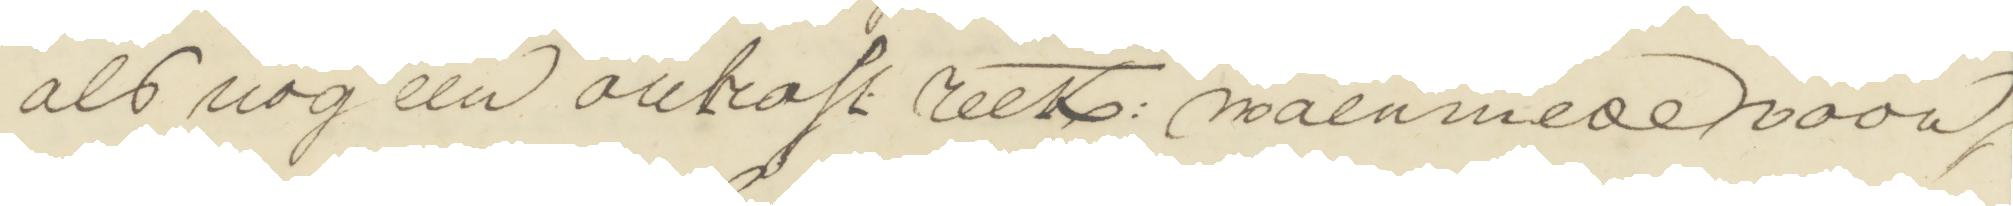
als nog een onkost reek: waermede voor„
